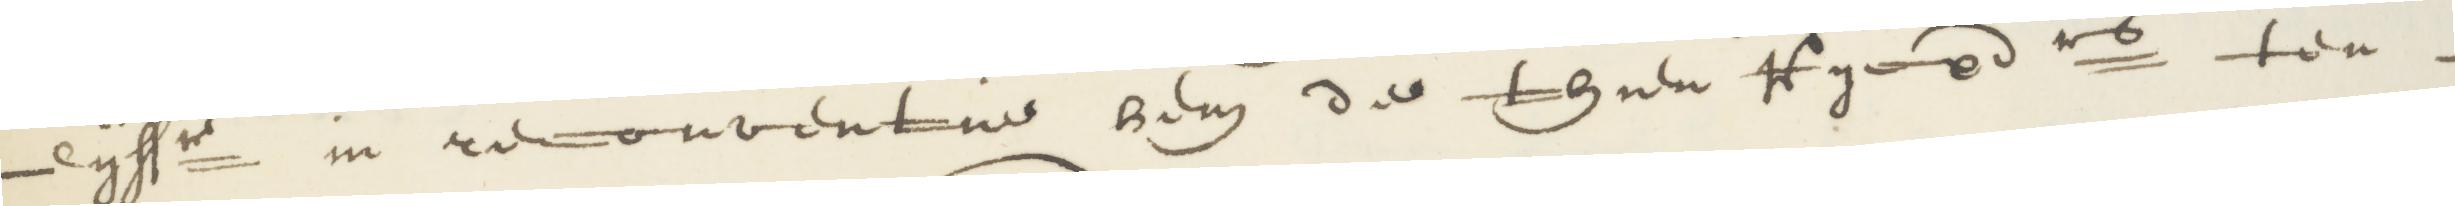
eijss=r in reconventie hem de thien Rijcxd=rs ten
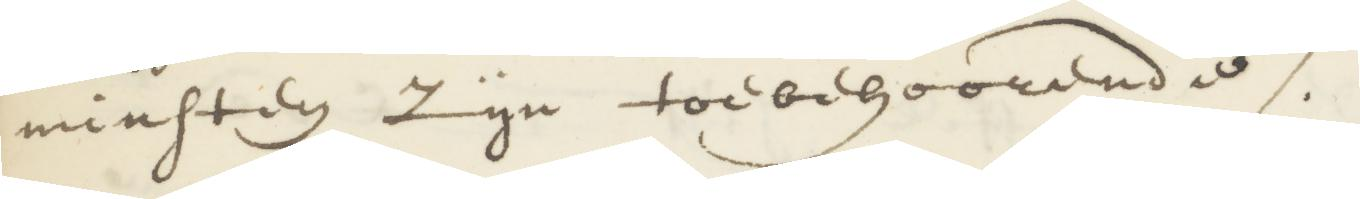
minsten zijn toebehoorende/.
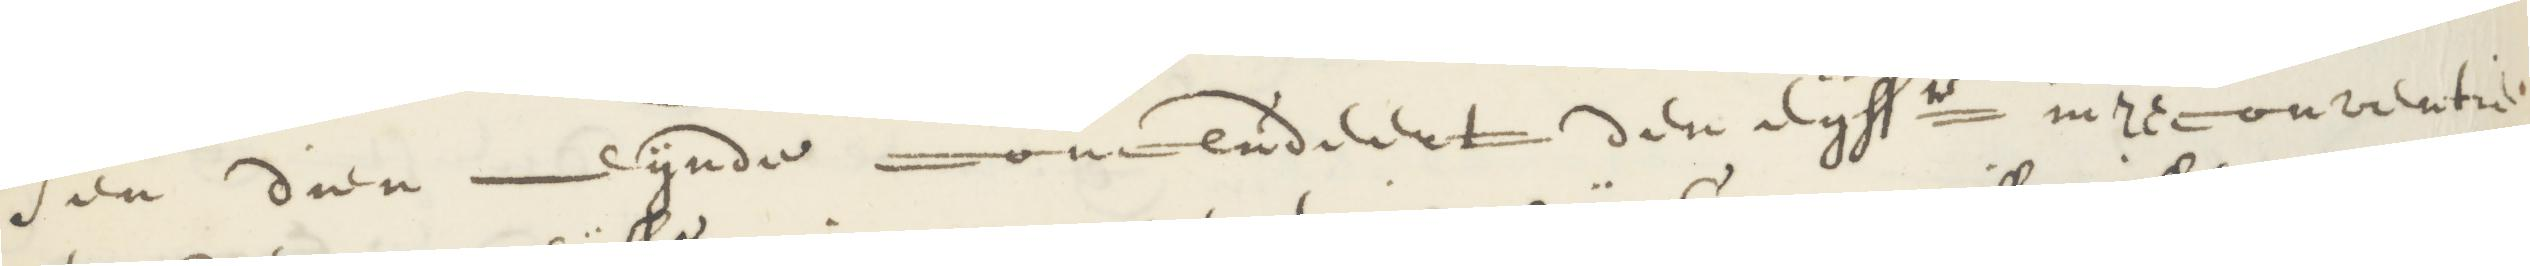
Ten dien eijnde concludeert den Eijss=r in reconventie
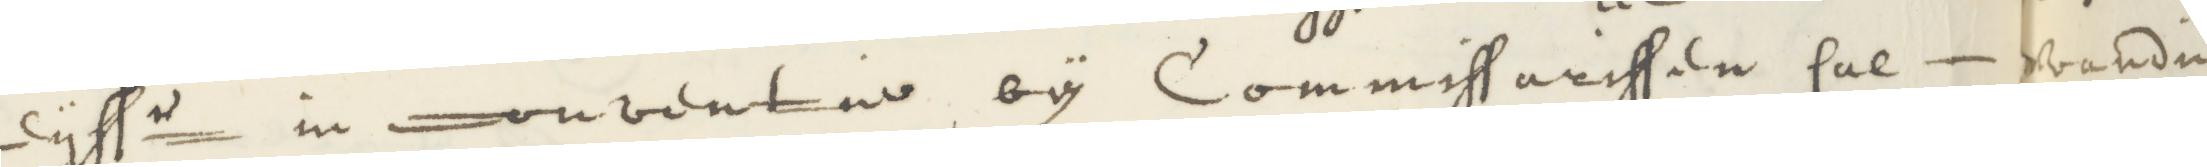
eijss=r in conventie bij Commissarissen sal —
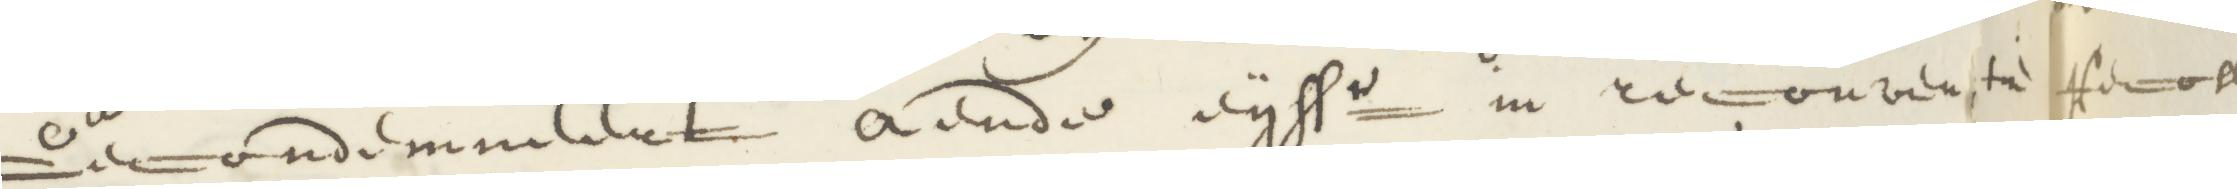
Gecondemeert aende eijss=r in reconventie
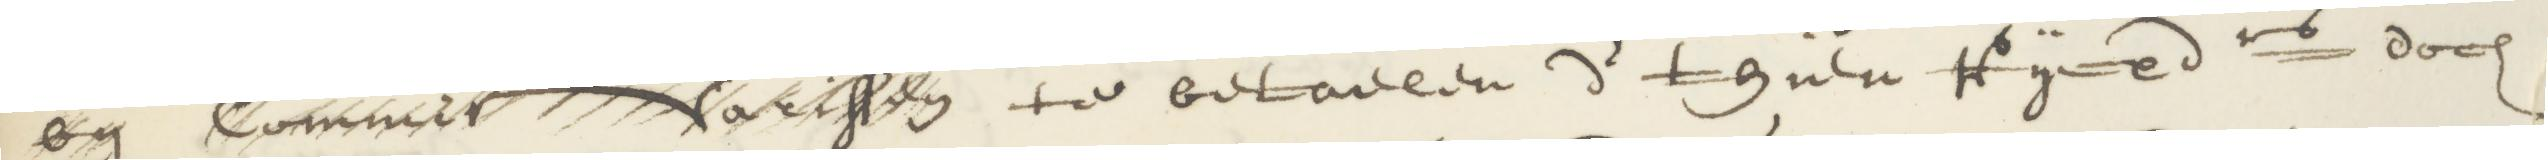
bij Commisarissen te betaelen d’ thien Rijcxd=rs doch
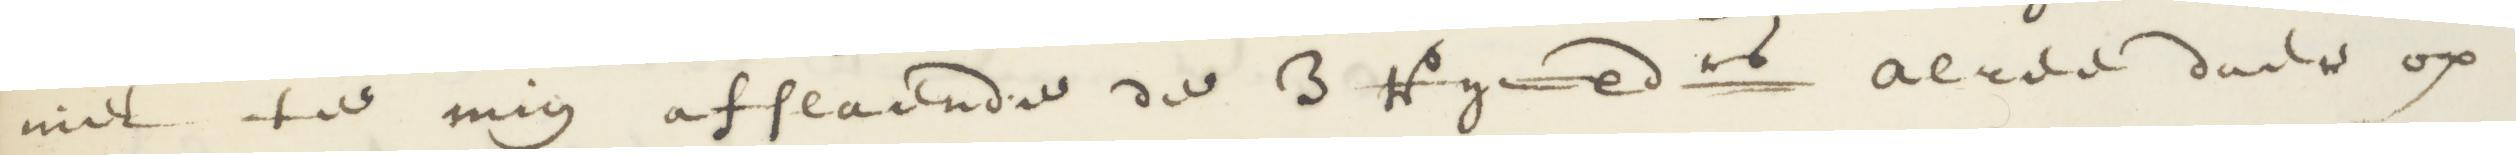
niet te min afslaende de 3 Rijcxd=rs alree daer op
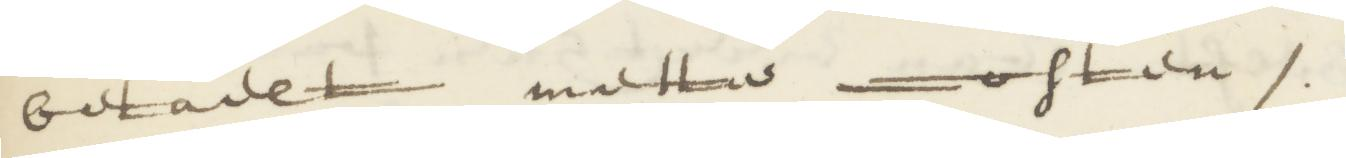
betaelt mette costen/.
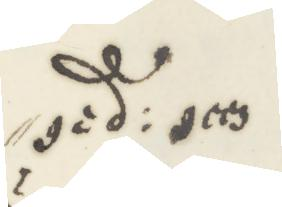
„ged:e een
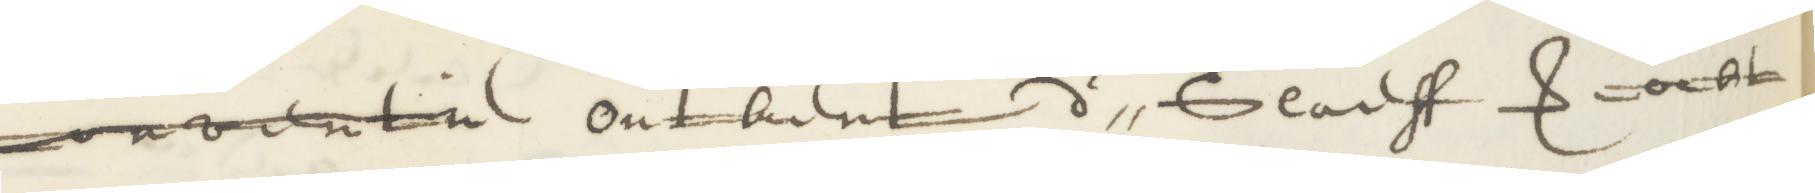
conventie ontkent d’„ Slaeff vercocht
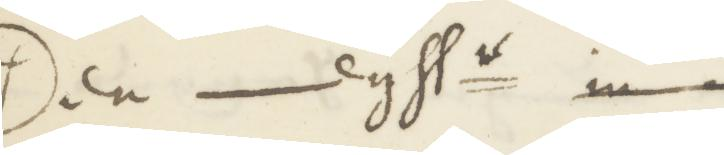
den eijss=r in
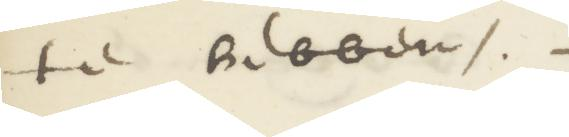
te hebben/.
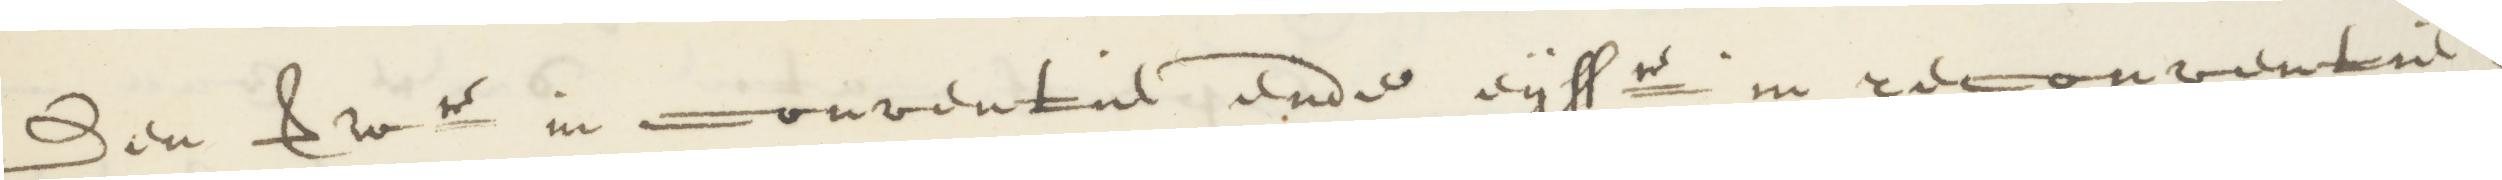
Den verw=r in conventie ende eijss=r in reconventie
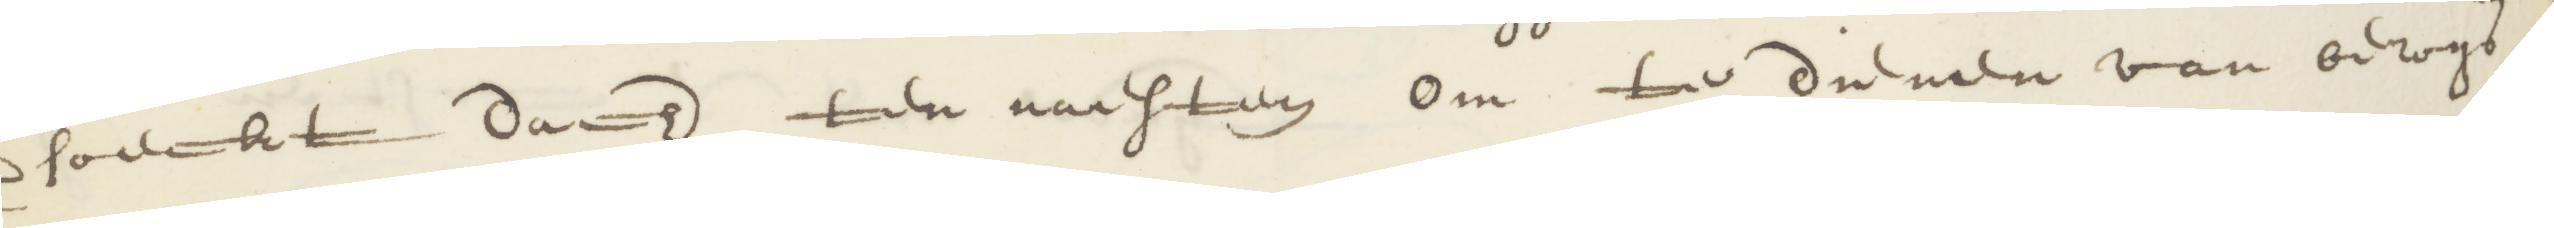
versoeckt dach ten naesten om te dienen van bewijs/.
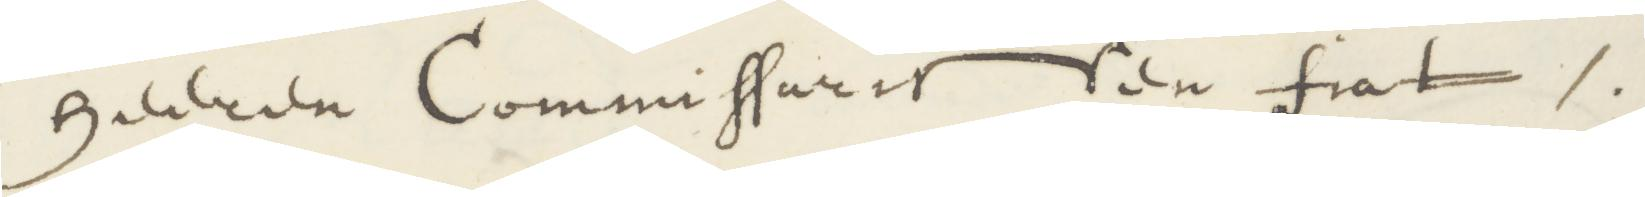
D' heeren Commissarissen fiat /.
